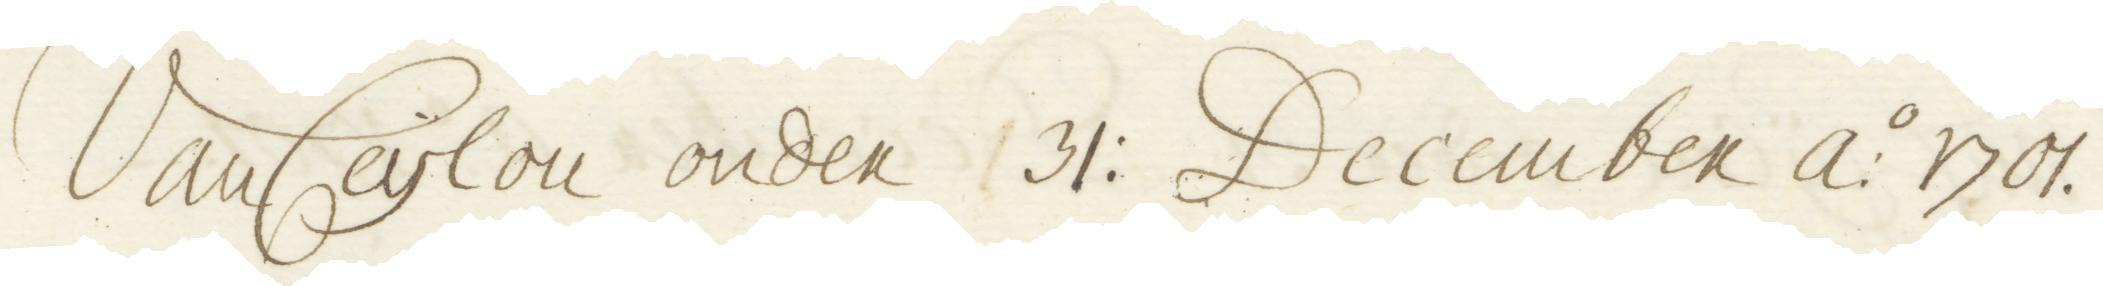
VanCeijlon onder 31: December a:o 1701.
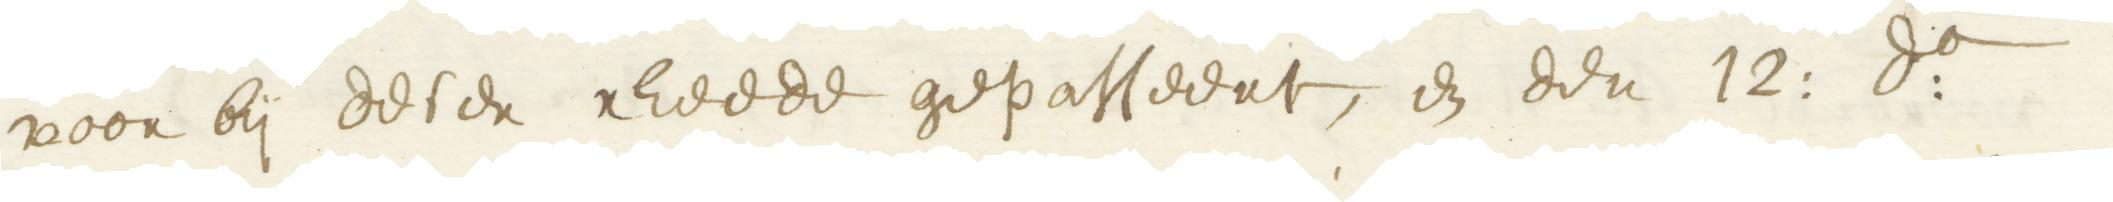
voor bij deser rheede gepasseert, en den 12: d:o
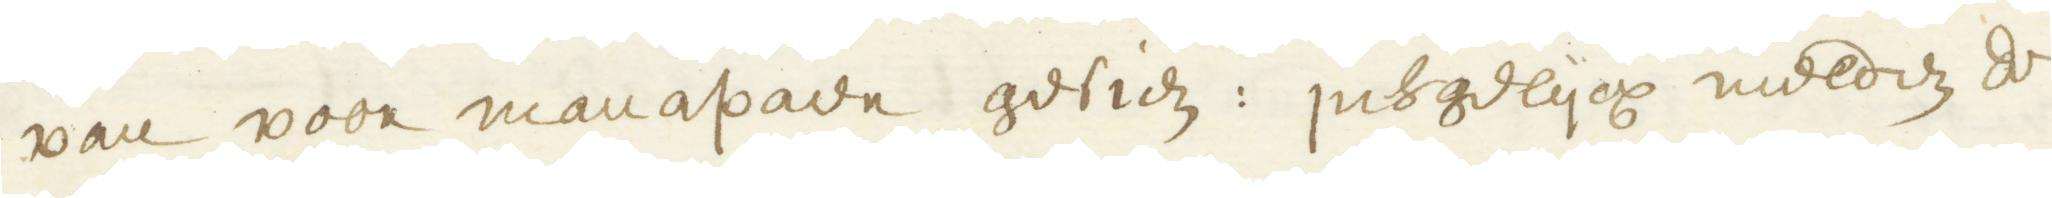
van voor manapaer gesien: insgelijcx melden de
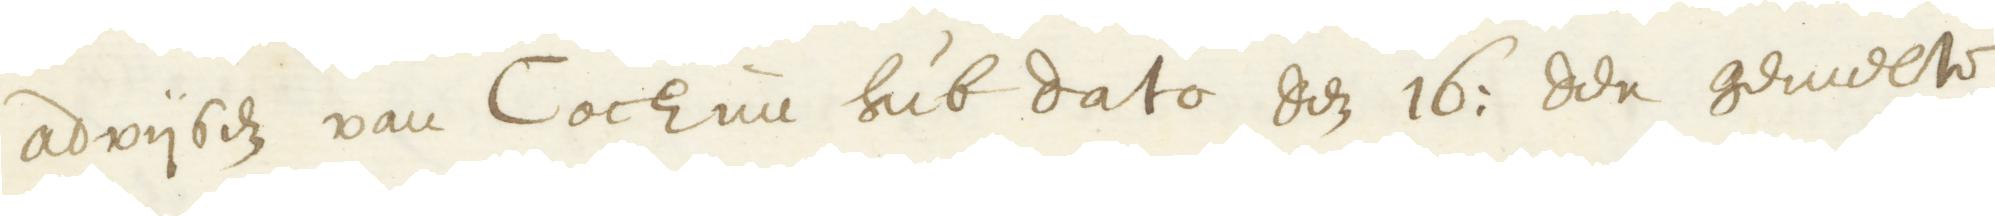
advijsen van Cochim sub dato den 16: der gemelte
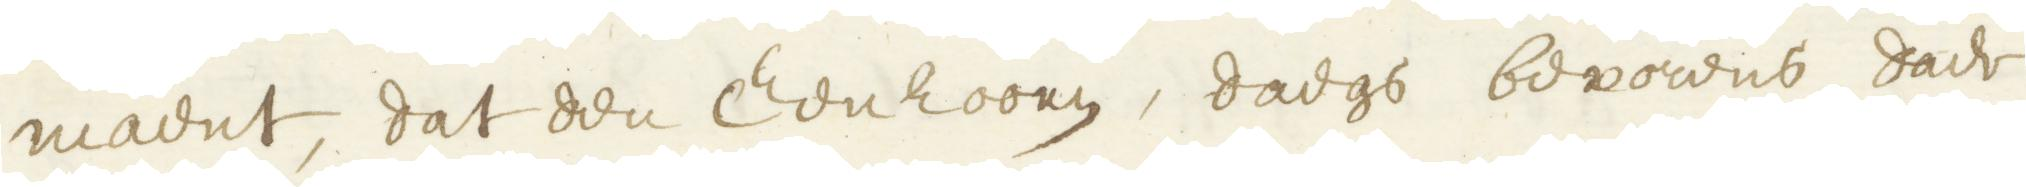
maent, dat den Eenhoorn, daegs bevorens daer
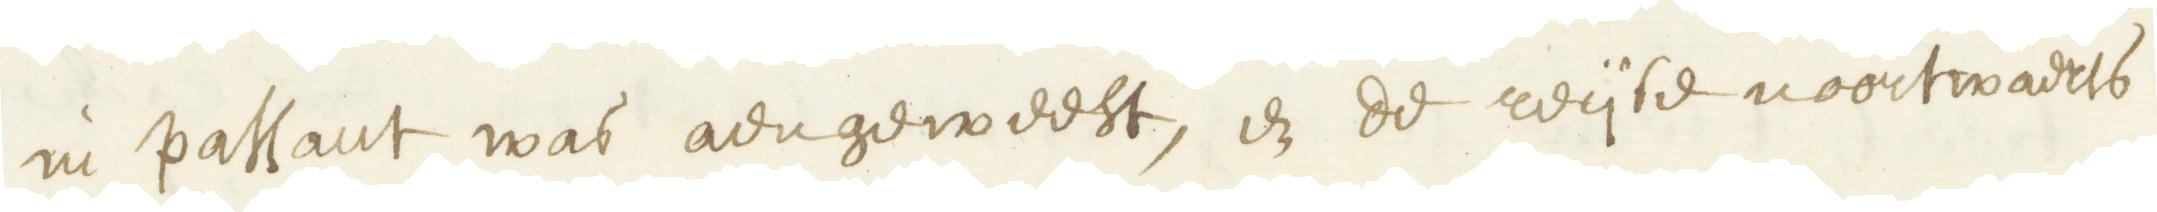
in passant was aengeweest, en de reijse voortwaerts
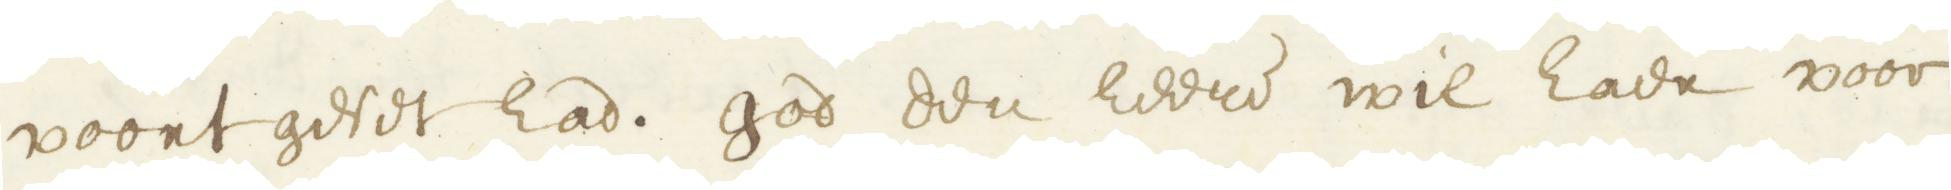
voort geset had. god den heere wil haer voor
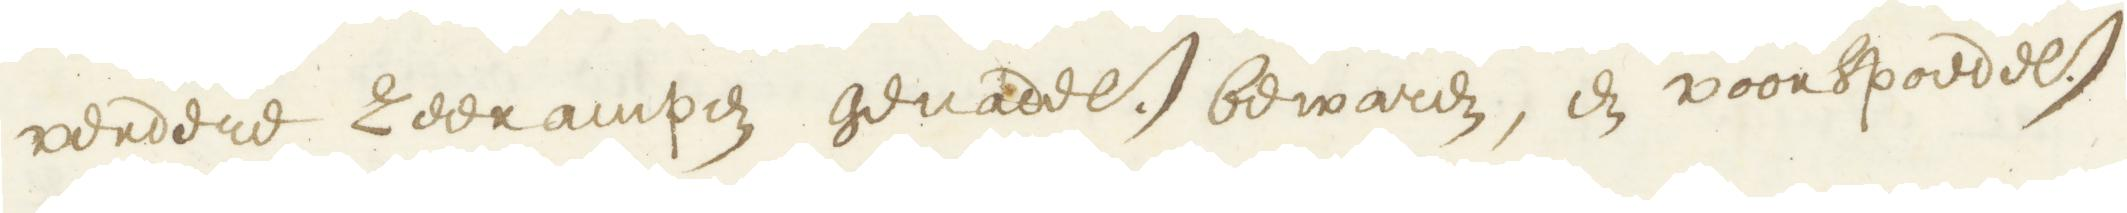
verdere zeerampen genadelijk bewaren, en voorspoedelijk
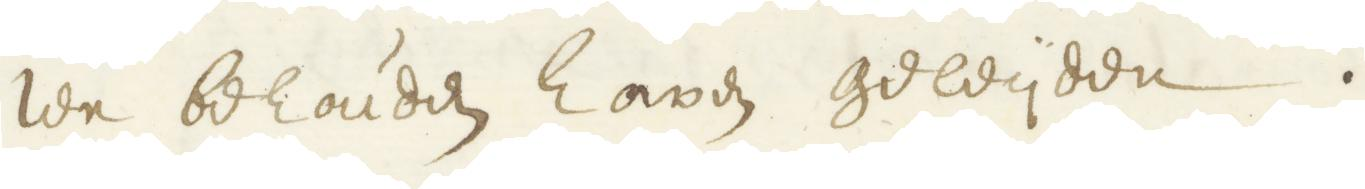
ter behouden haven geleijden.
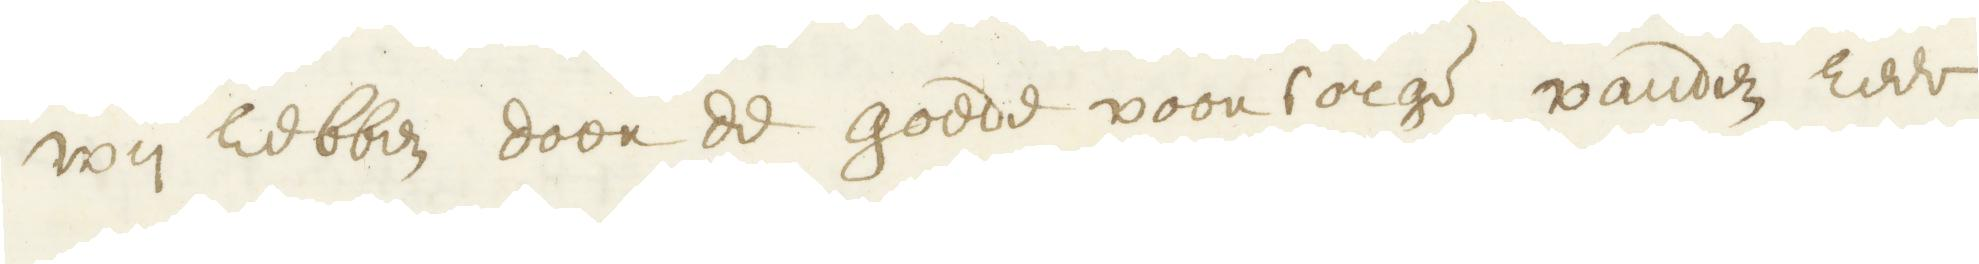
wij hebben door de goede voorsorge vanden heer
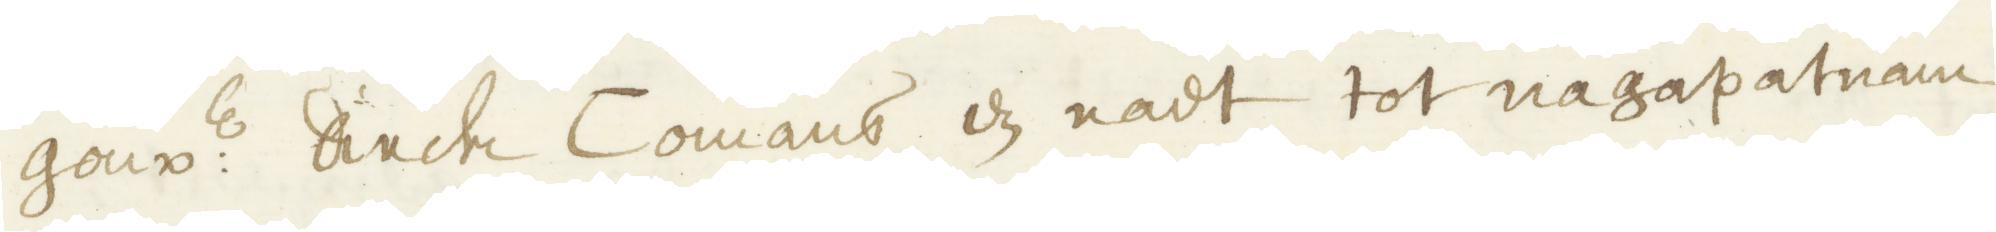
gouv:r Dirck Comans en raet tot nagapatnam
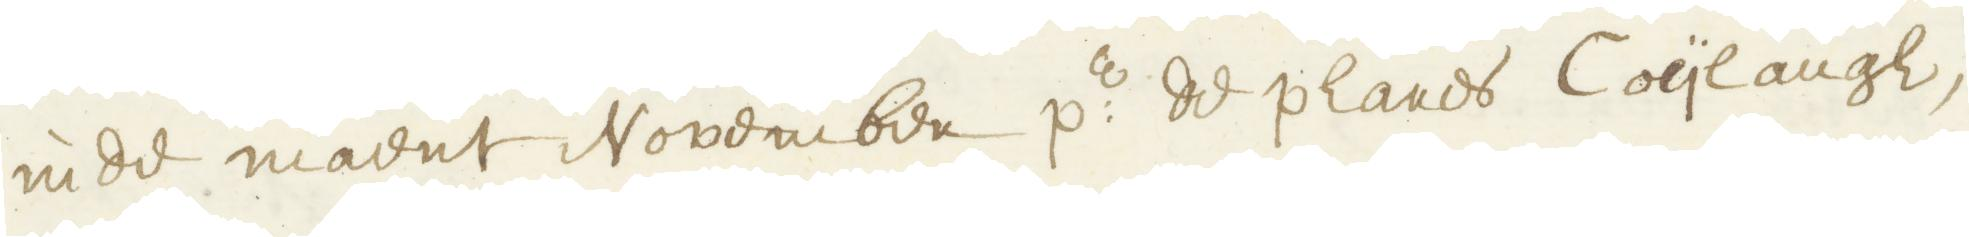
in de maert November p:r de phares Coijlangh,
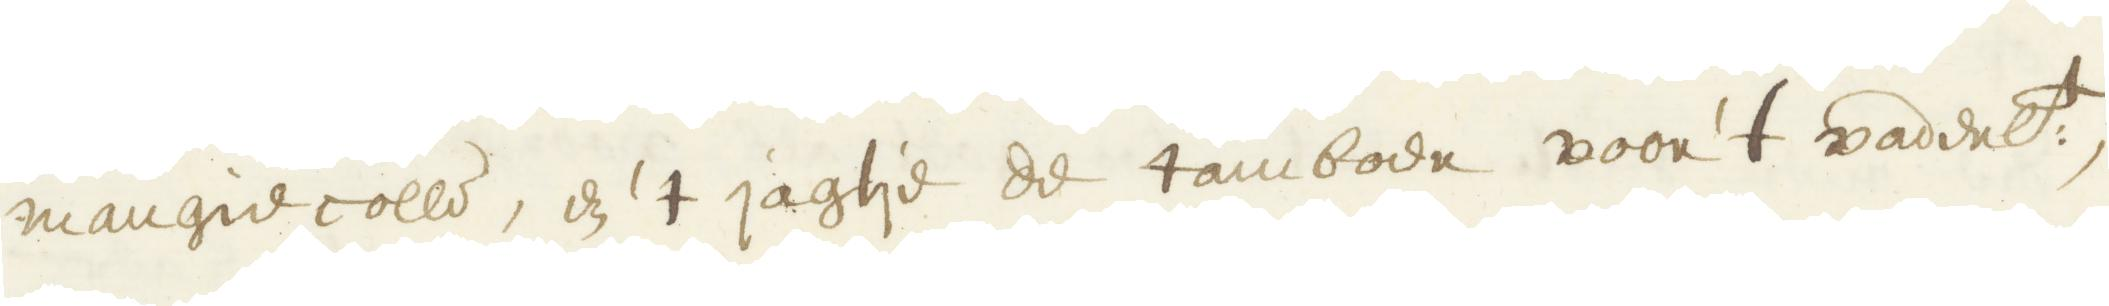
mangiecolle, en ’t jagtje de tamboer voor ’t vaderl:t,
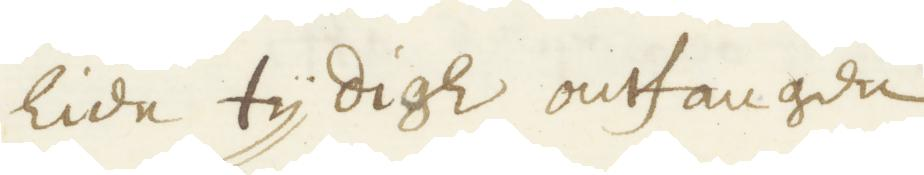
hier tijdigh ontfangen
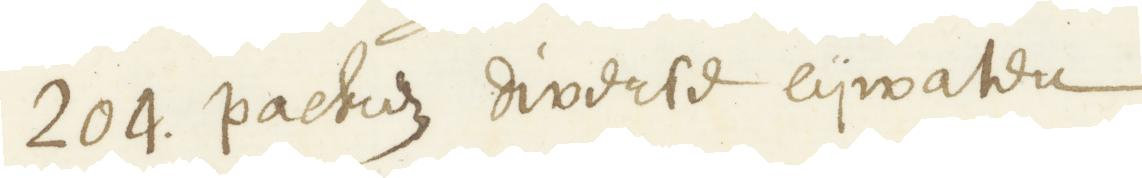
204. packen diverse lijwaten
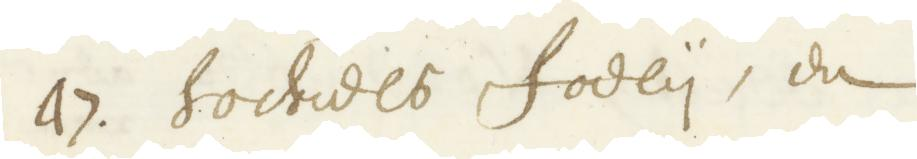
47. sockels foelij, en
